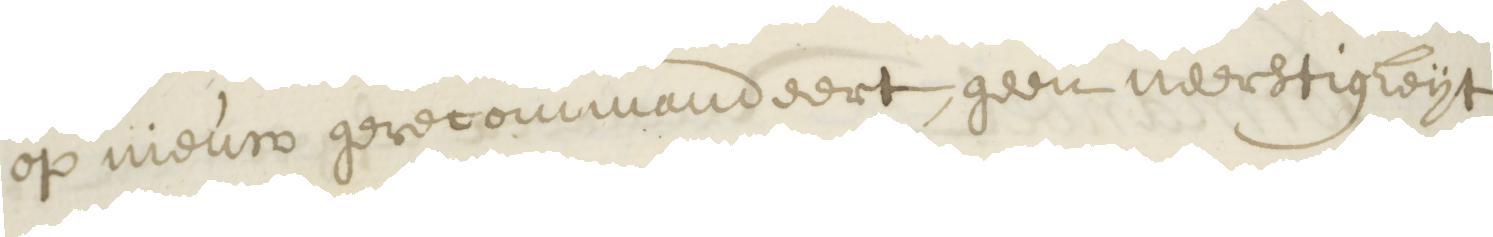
op nieuw gerecommandeert geen neerstigheijt
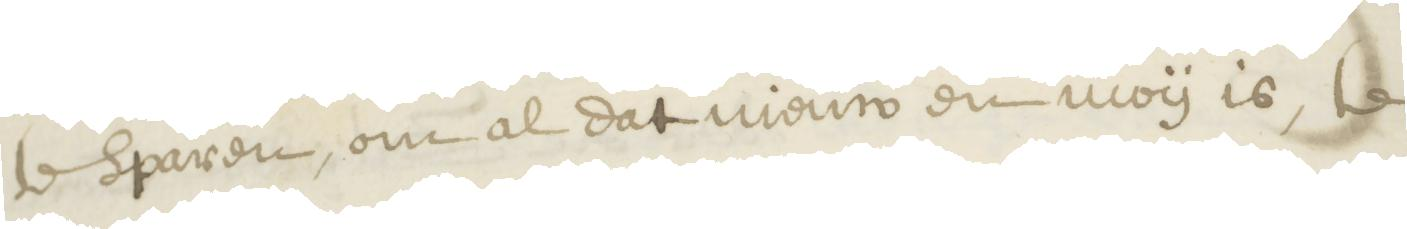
te sparen, om al dat nieuw en moij is, te
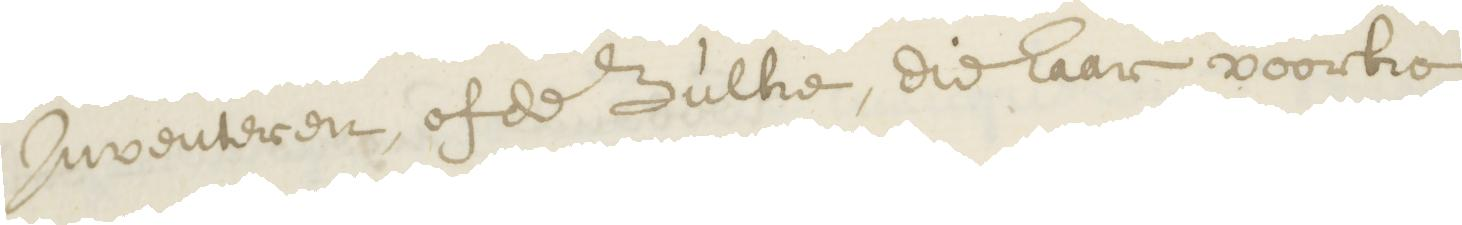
Inventeren, of de zulke, die haar voorko
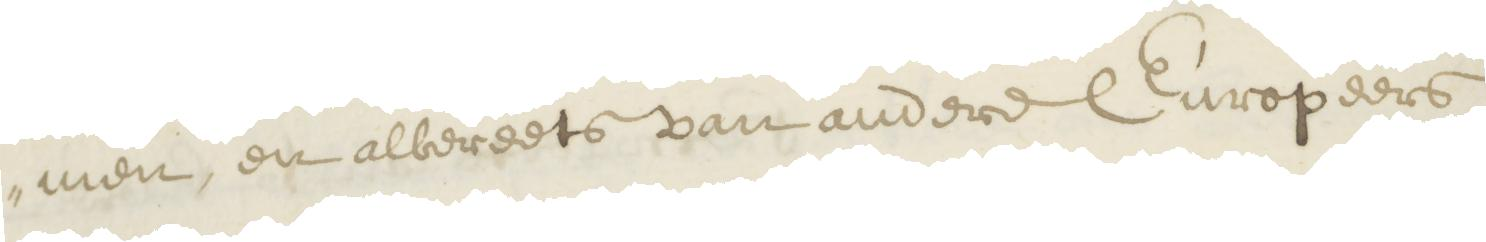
„men, en allereets van andere Europeers
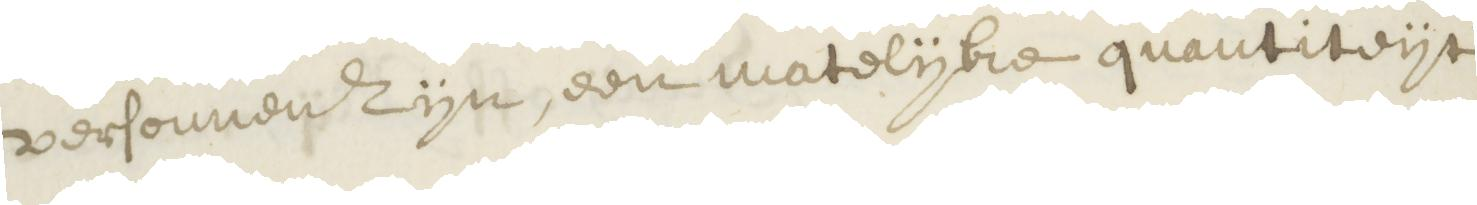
versonnen zijn, een matelijke quantiteijt
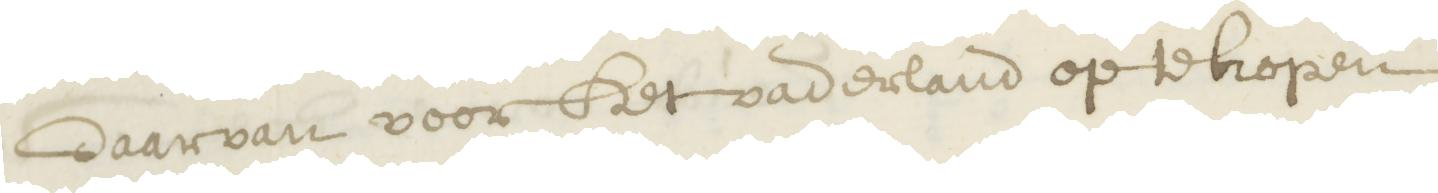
daarvan voor het vaderland op te kopen
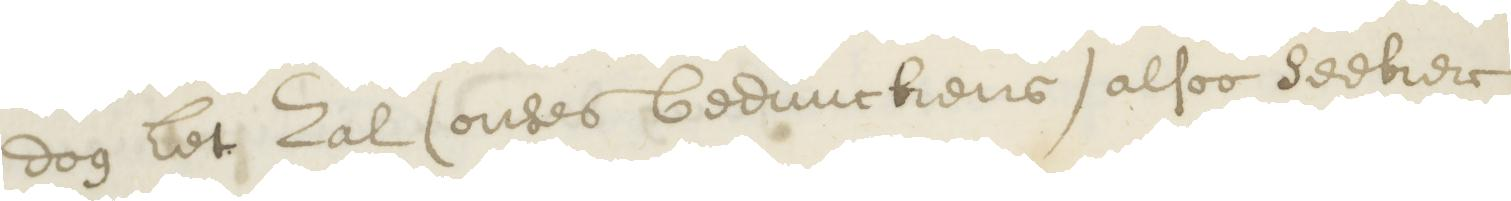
dog tot zal (onses bedunckens) alsoo seeker
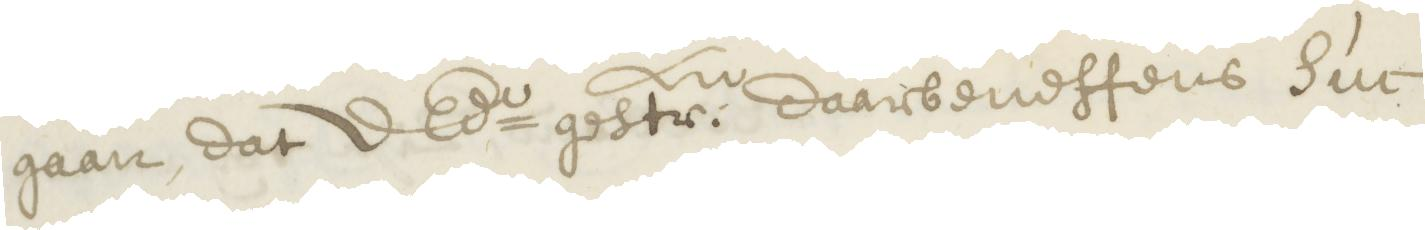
gaan, dat UEd=e gestr: daar beneffens suc
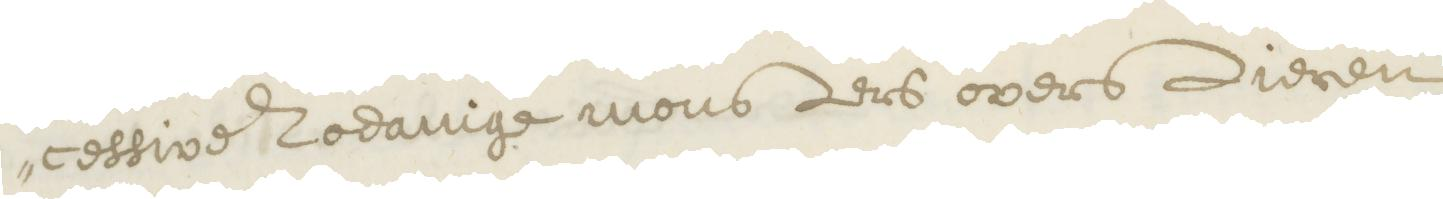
„cessive zodanige monsters overstieren
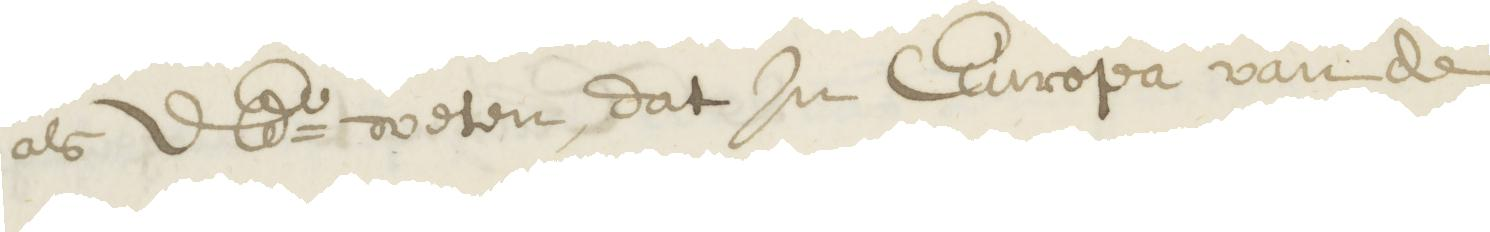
als UEd=e weten, dat In Europa van de
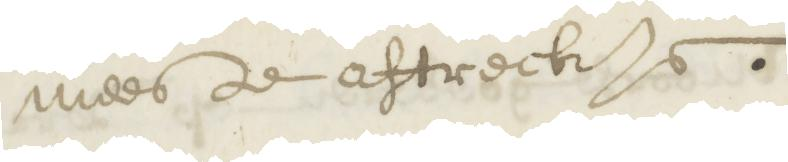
meeste aftreckis.
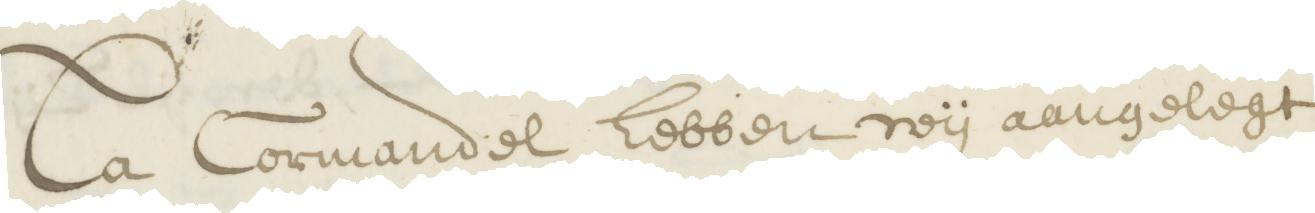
Na Cormandel hebben wij aangelegt
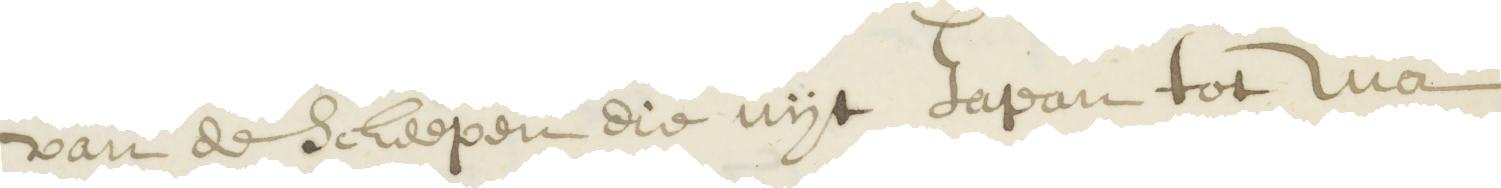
van de scheepen die uijt Japan tot ma
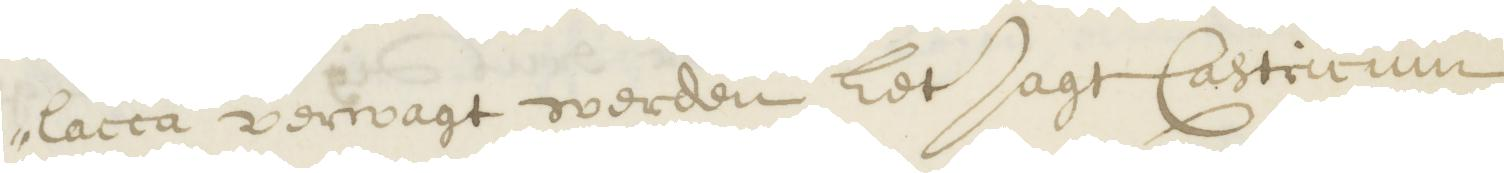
„lacca verwagt werden, het Jagt Castricum
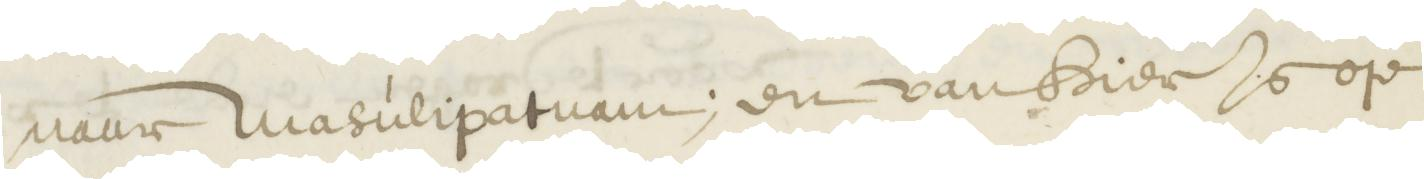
naar Masulipatnam; en van hier is op
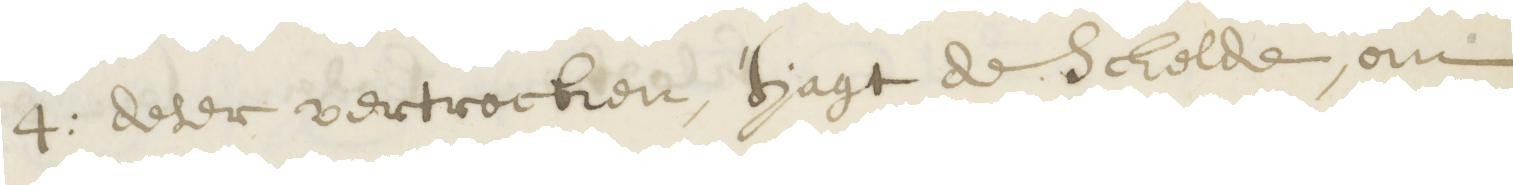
4: deser vertrocken, 'tjagt de schelde, om
